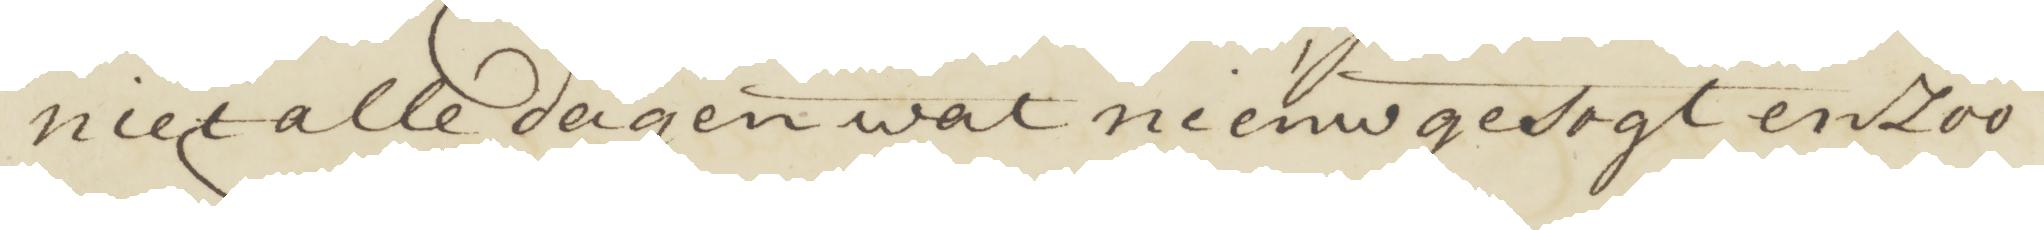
niet alle dagen wat nieuw gesogt en zoo
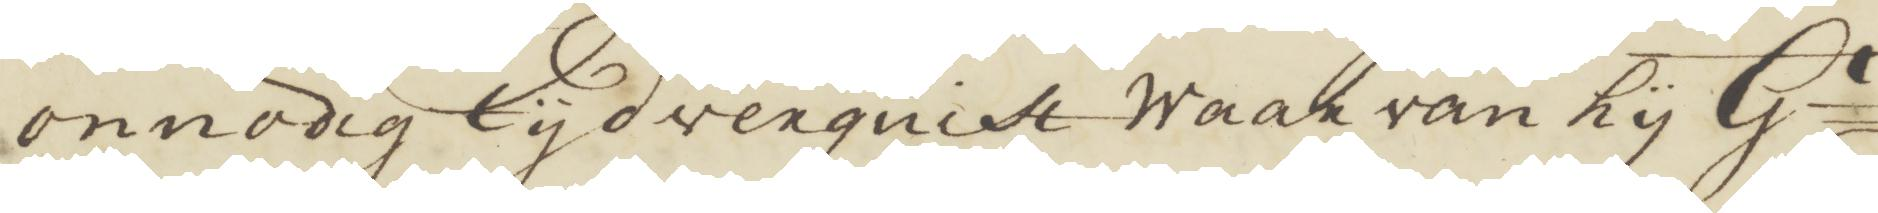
onnodig tijd verquist waar van hij G=t
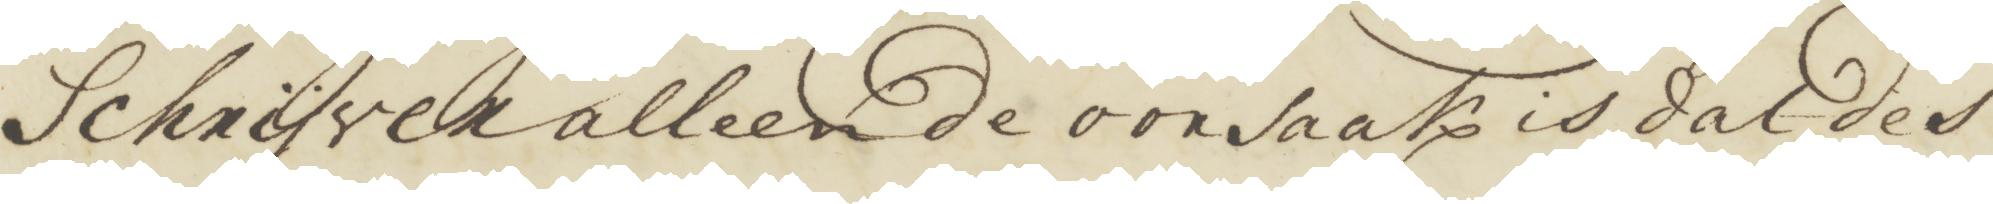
schrijver alleen de oorsaak is dat des
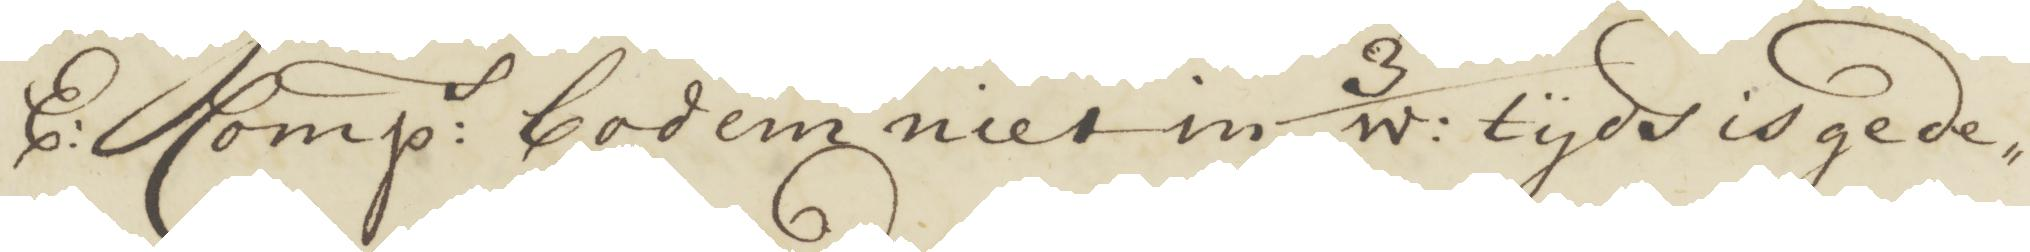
E: Comp:s bodem niet in 3/w: tijds is gede„
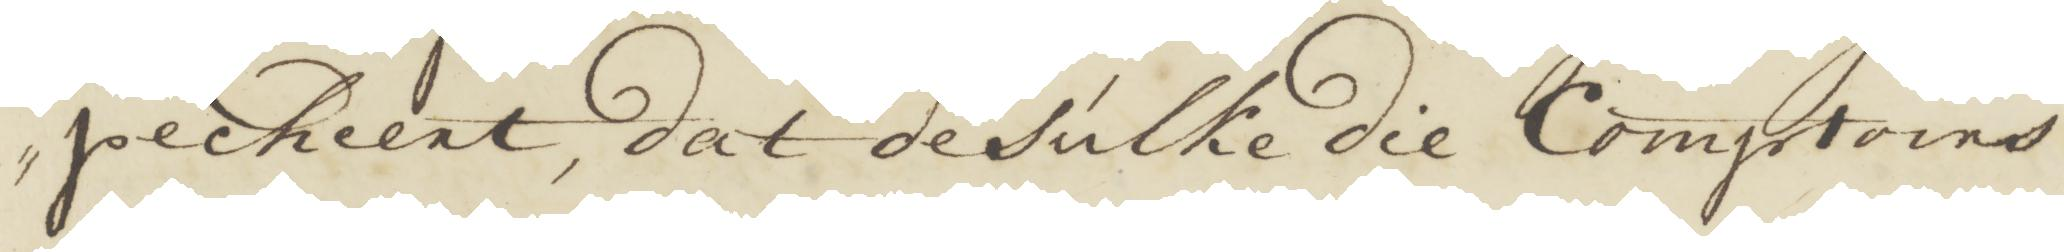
„pecheert, dat de sulke die Comptoirs
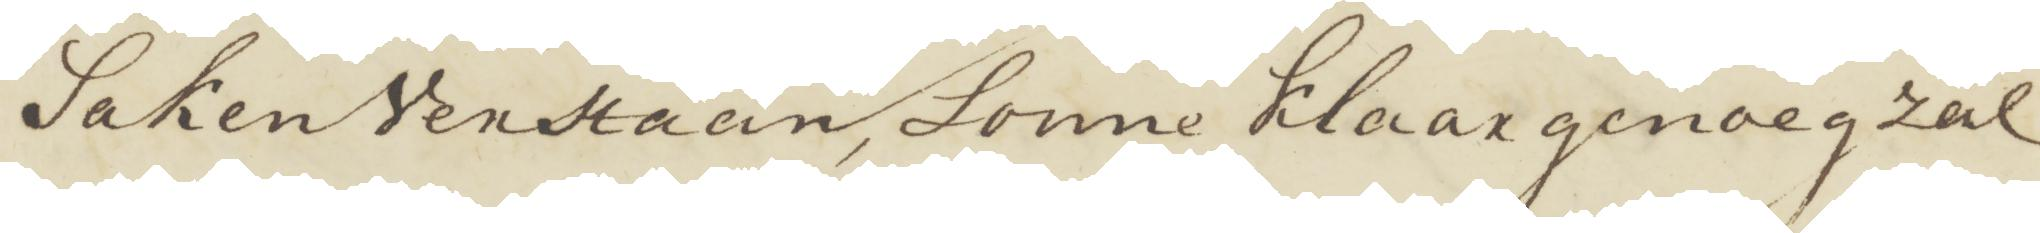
saken verstaan, sonne klaar genoeg zal
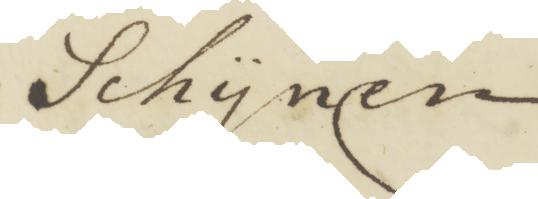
schijnen
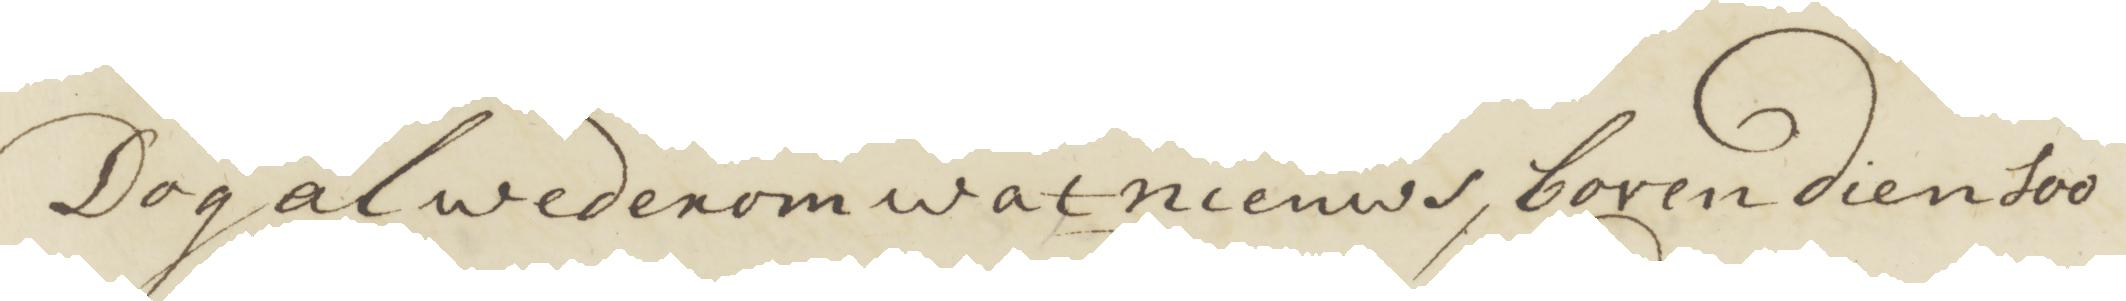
Dog al wederom wat nieuws, boven dien soo
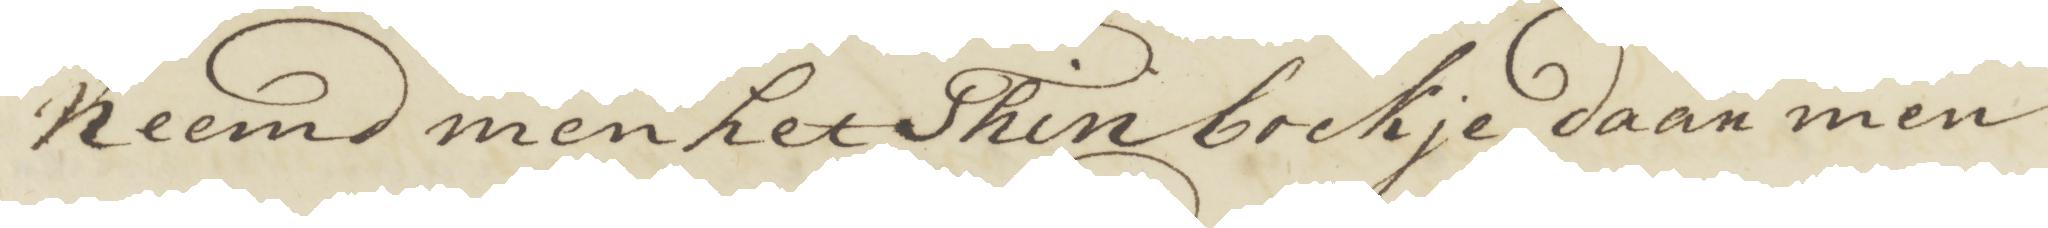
neemd men het Thin boekje daar men
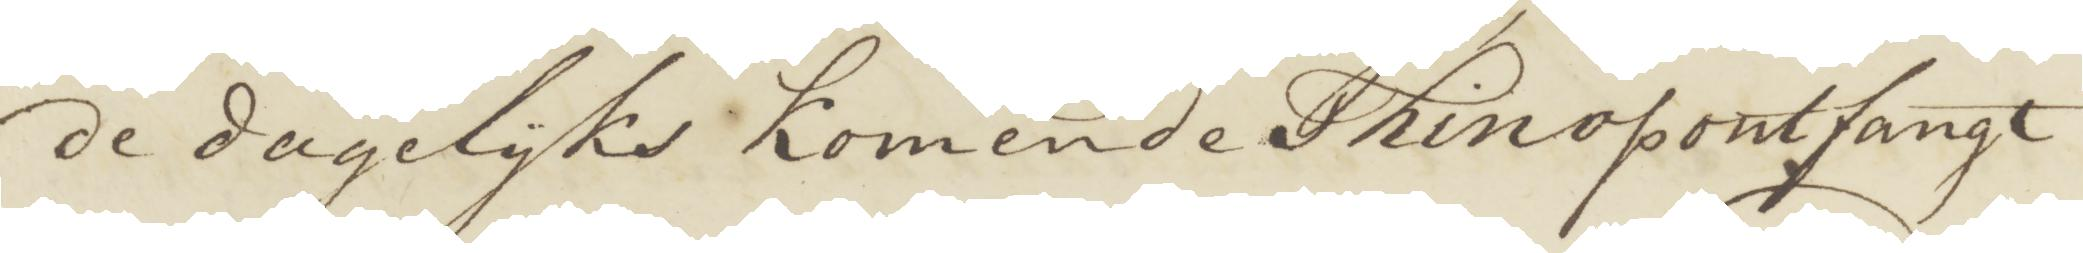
de dagelijks komende Thin op ontfangt
